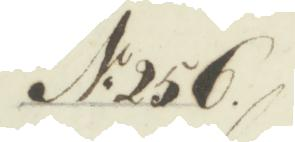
N„o 256.
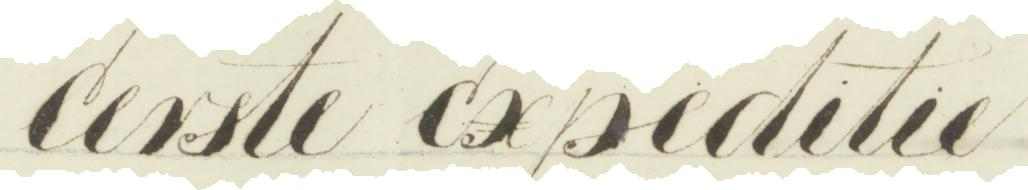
Eerste Expeditie
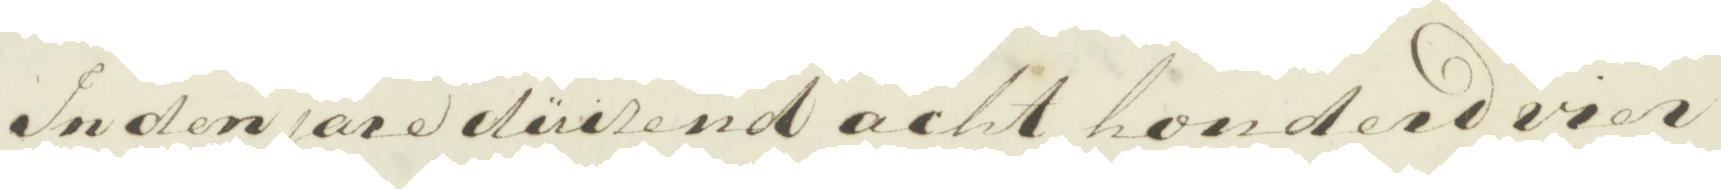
In den jare duizend acht honderd vier
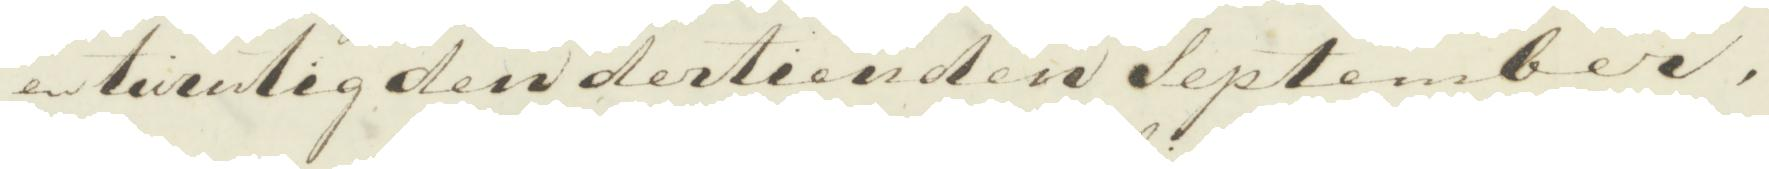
en twintig den dertienden September,
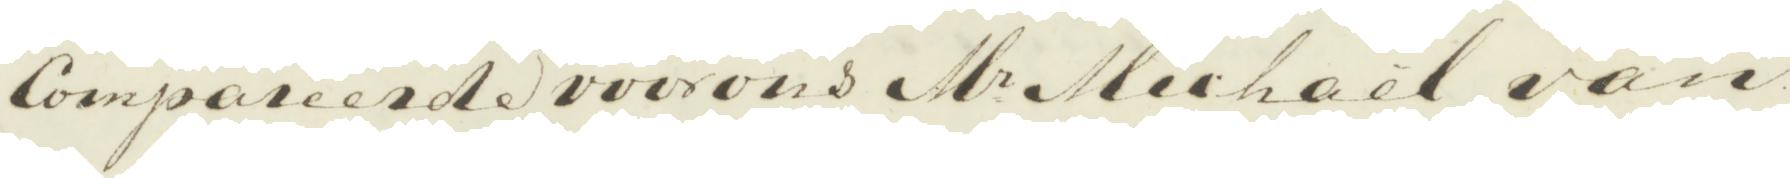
compareerde voor ons Mr Michaël van
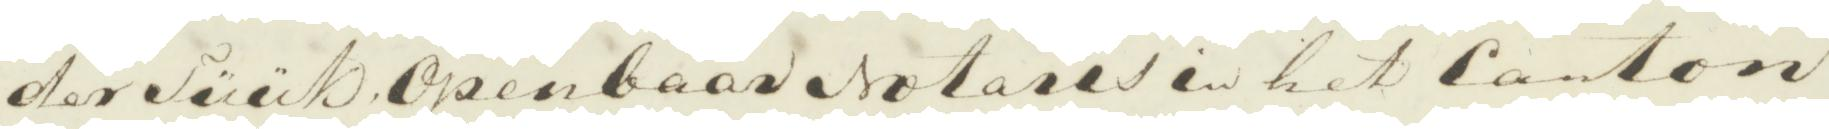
der Tuuk, Openbaar Notaris in het Canton
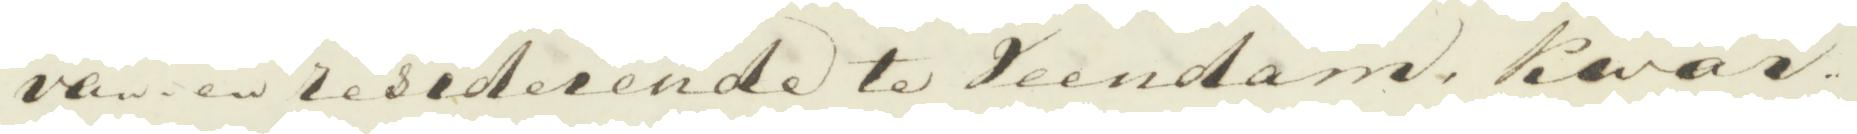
van en residerende te Veendam, kwar„
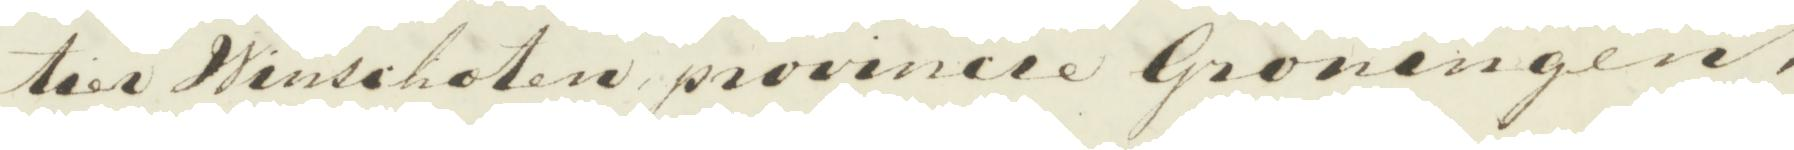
tier Winschoten, provincie Groningen,
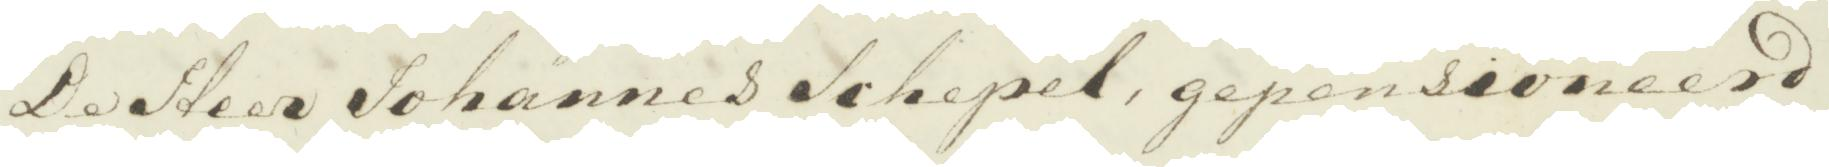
De Heer Johannes Schepel, gepensioneerd
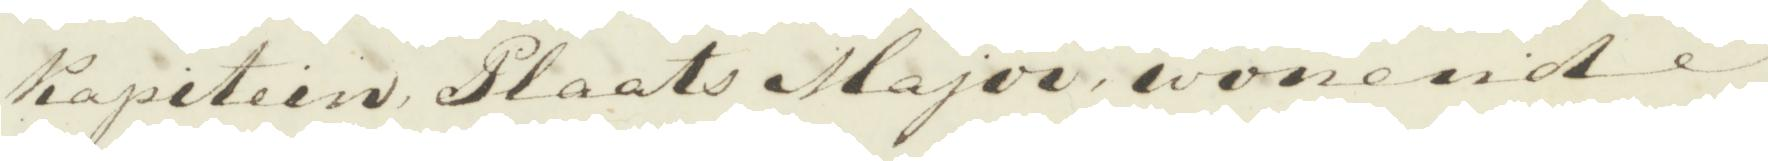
Kapitein, Plaats Major, wonende
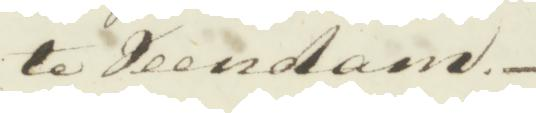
te Veendam.-
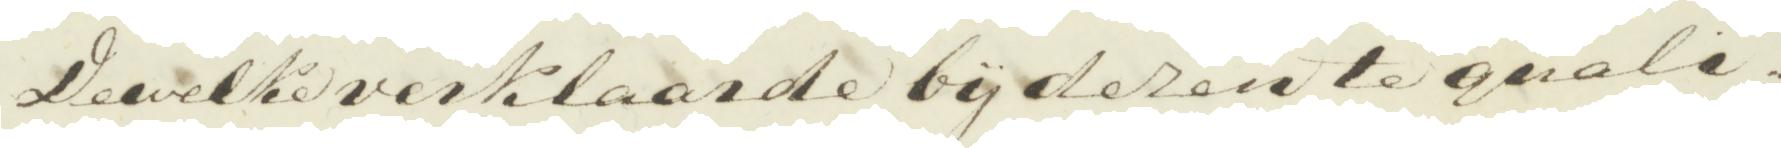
Dewelke verklaarde bij dezen te quali„
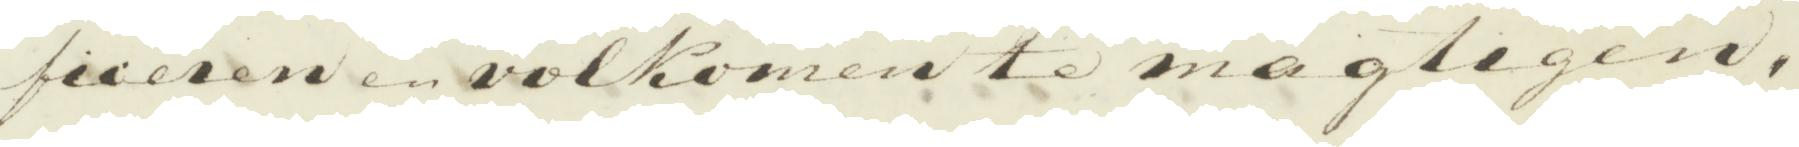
ficeren en volkomen te magtigen,
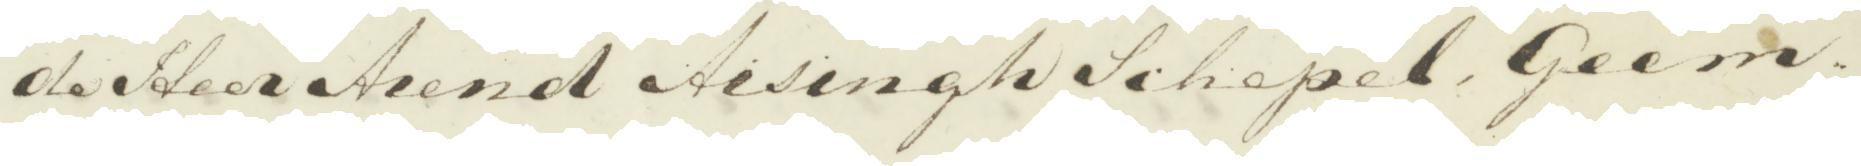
de Heer Arend Aisingh Schepel, Geem„
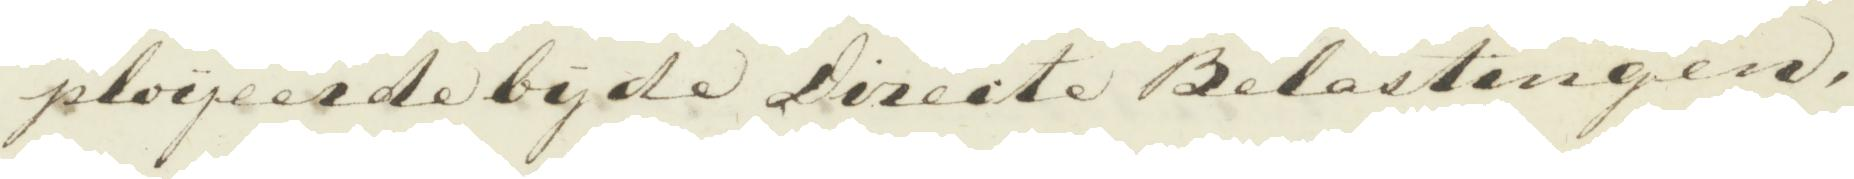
ploijeerde bij de Directe Belastingen,
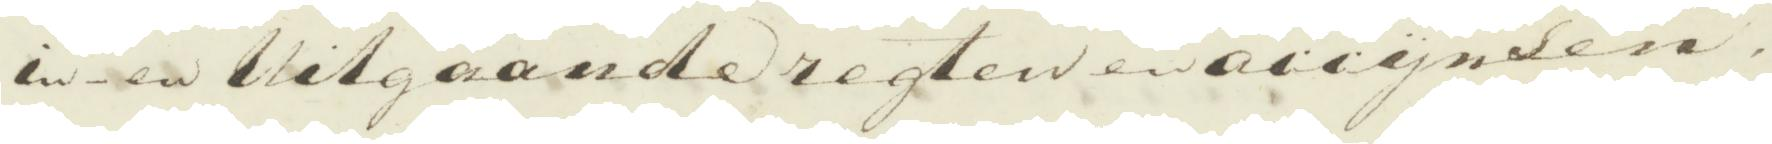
in- en Uitgaande regten en accijnsen,
